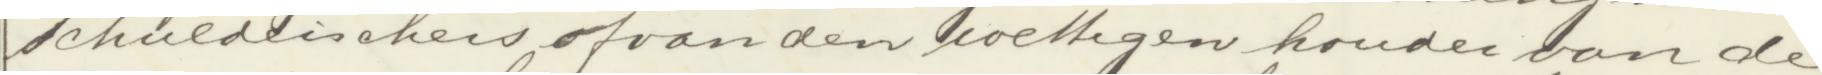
schuldeischers of van den wettigen houder van de
